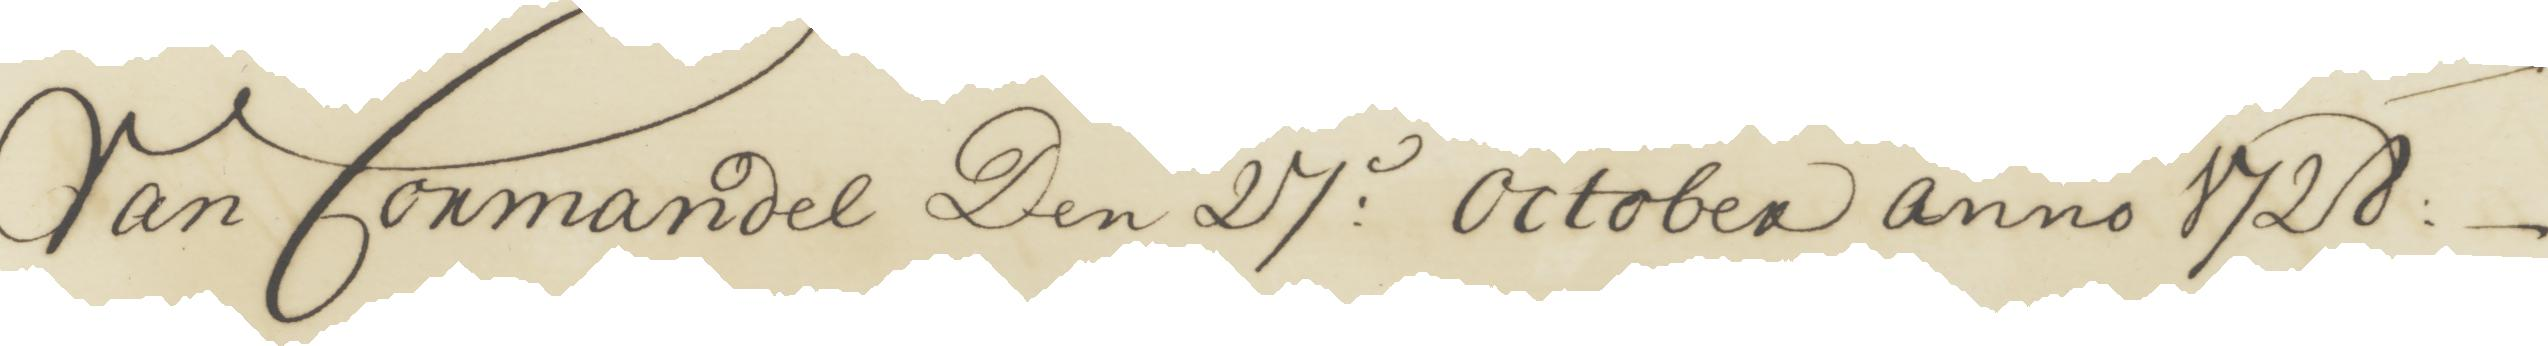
Van Cormandel Den 27:' October anno 1728:-
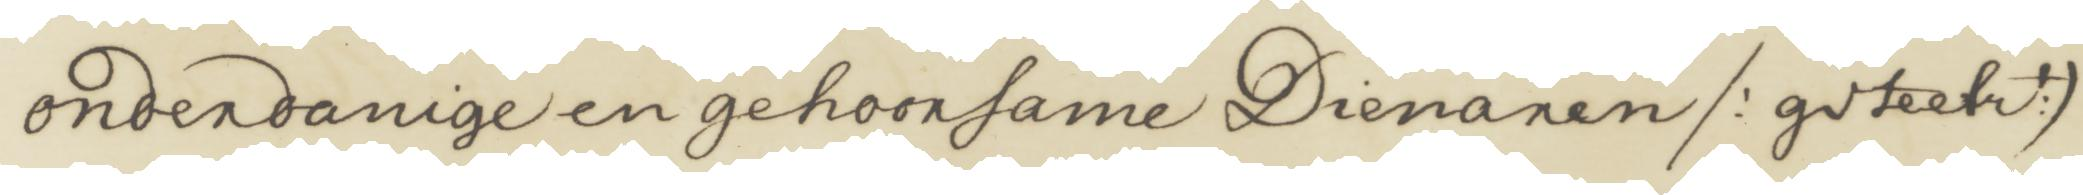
onderdanige en gehoorsame Dienaren (: geteek:t)
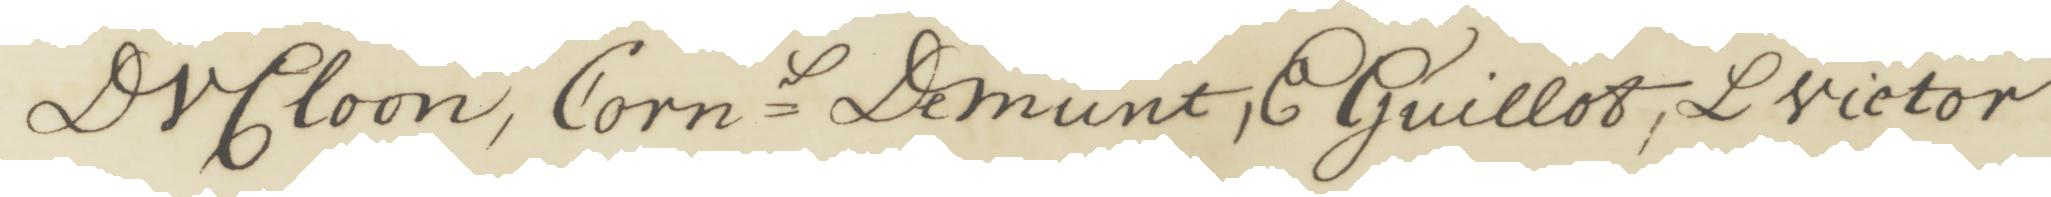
D V Cloon, Corn=s Demunt, E Guillot, L Victor
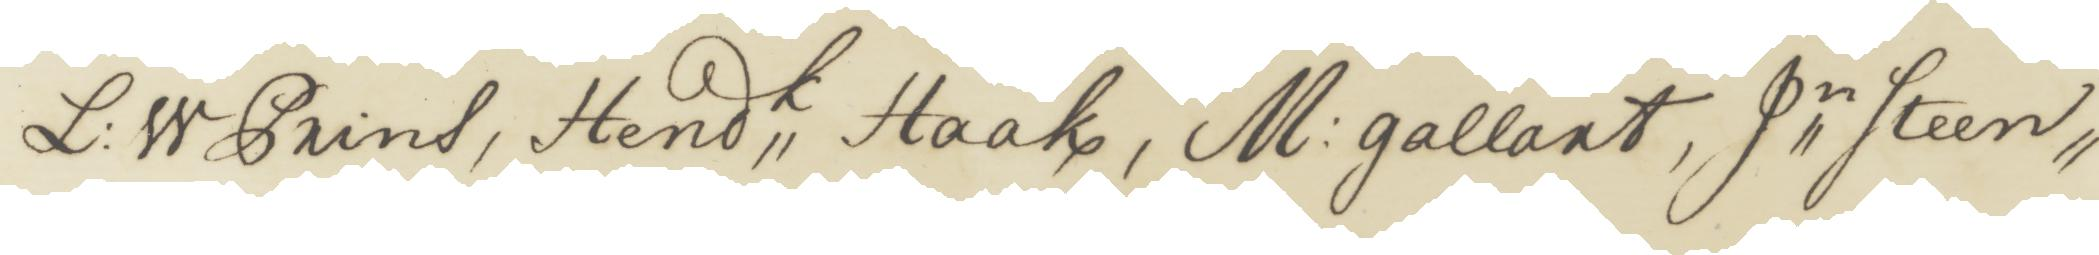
L: W Prins, Hend„k Haak, M: gallart, p„r Steen„
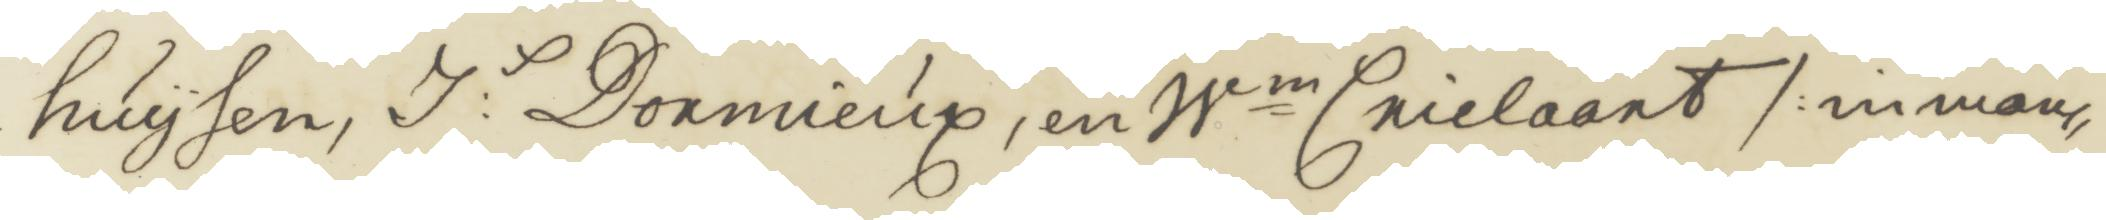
huijsen, I:s Dormieux, en W=m Crielaart (: in mar„
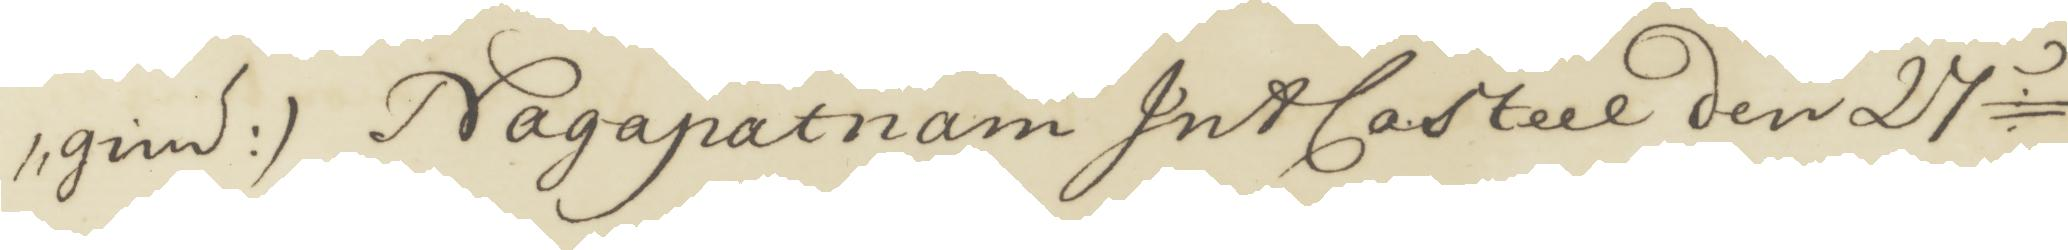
„gine:) Nagapatnam Jnt Casteel den 27='
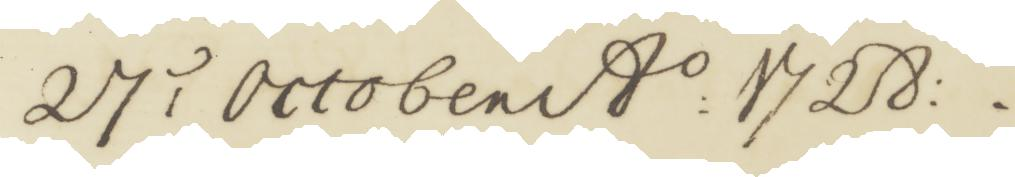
27:' October A:o 1728: .
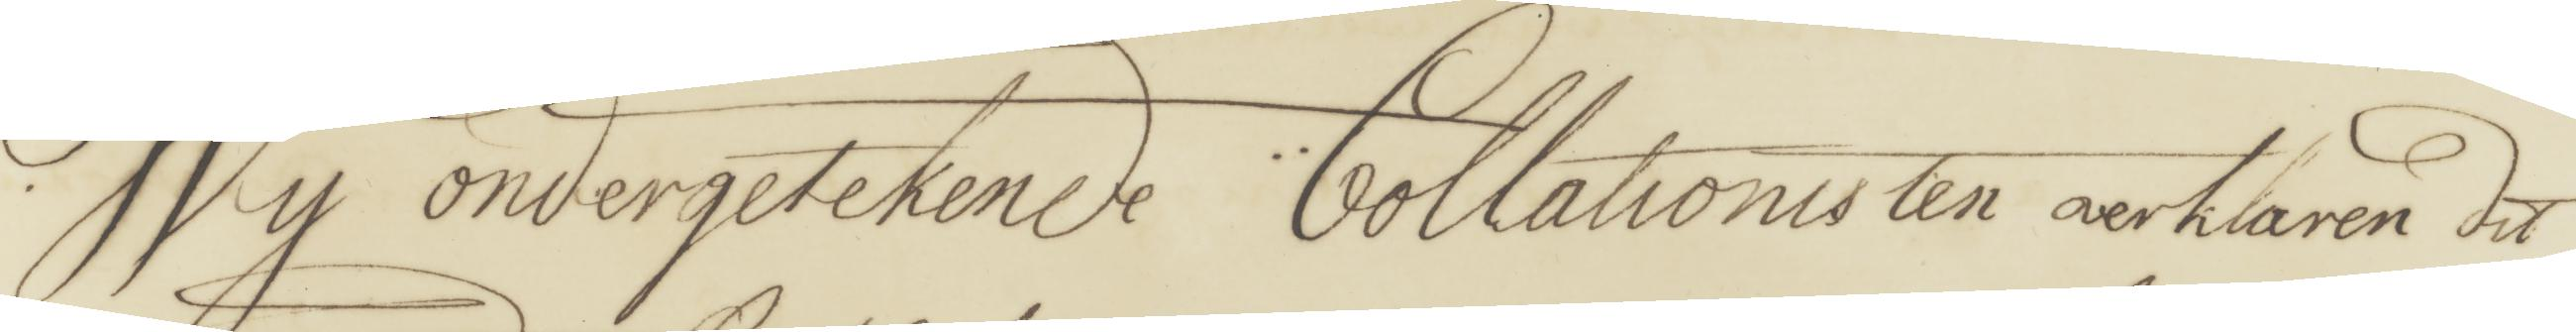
Wy ondergetekende Collationis ten verklaren dit
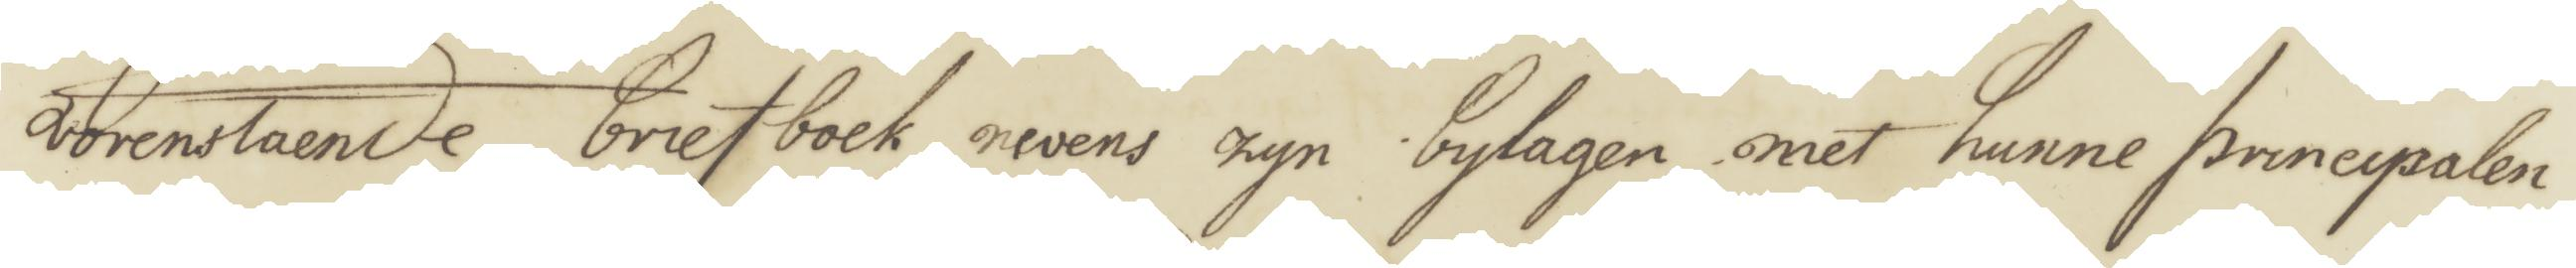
vorenstaende briefboek nevens zyn bylagen met hunne principalen
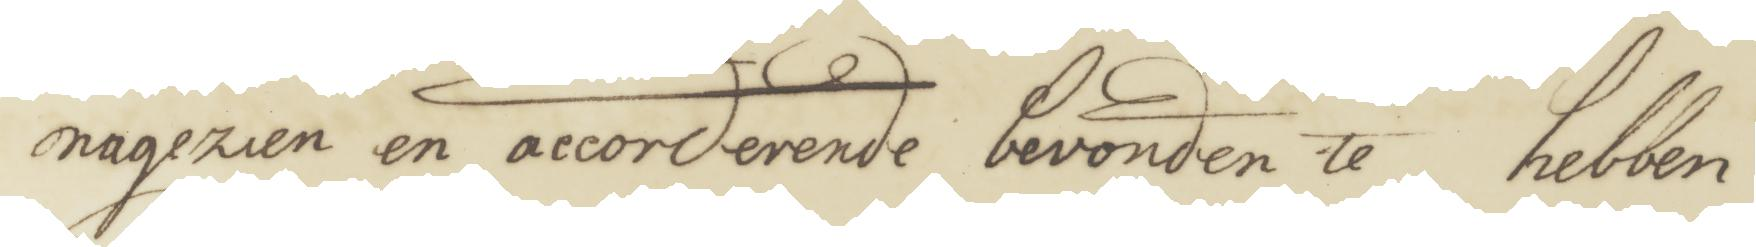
nagezien en accorderende bevonden te hebben
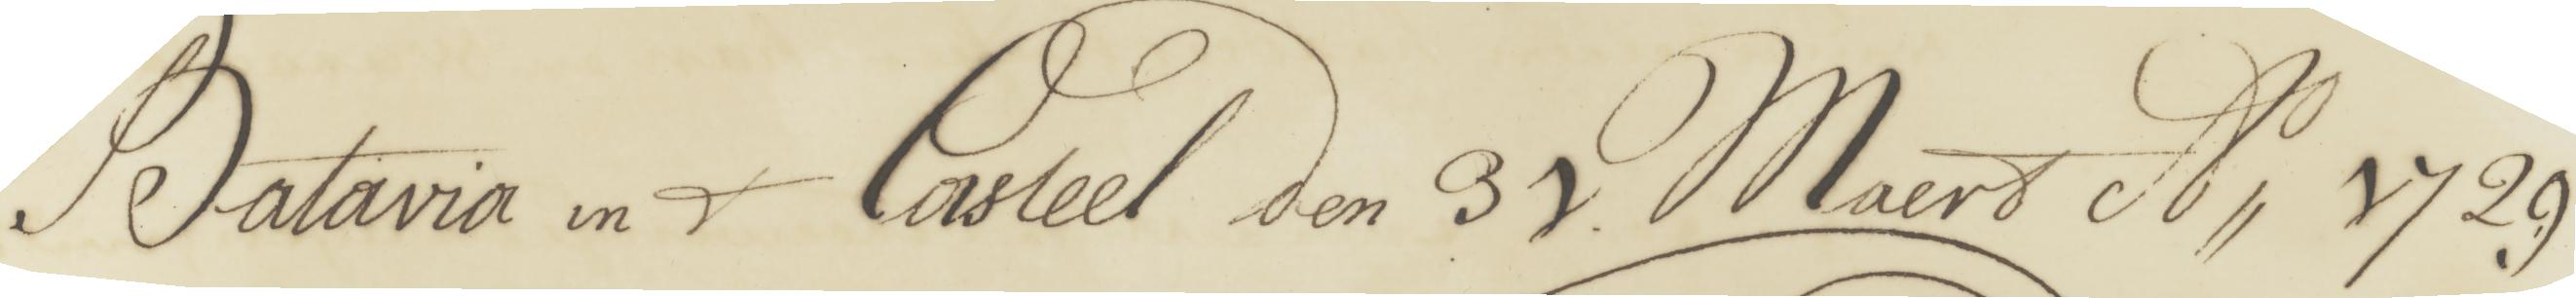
Batavia in t Casteel den 31. Maert A„o 1729.
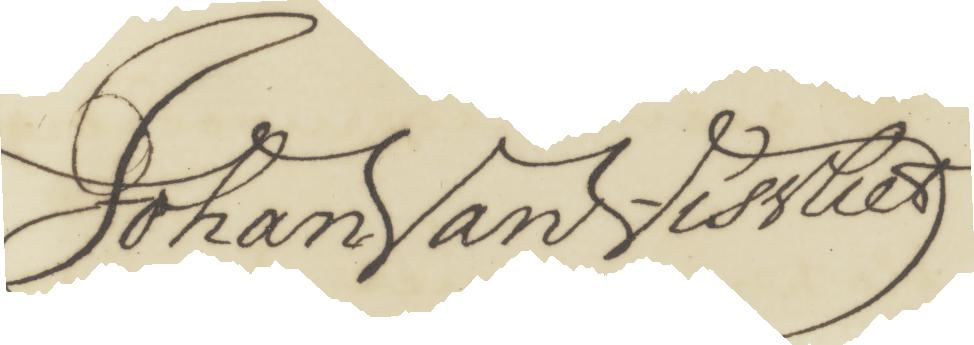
Johan Van Visvliet
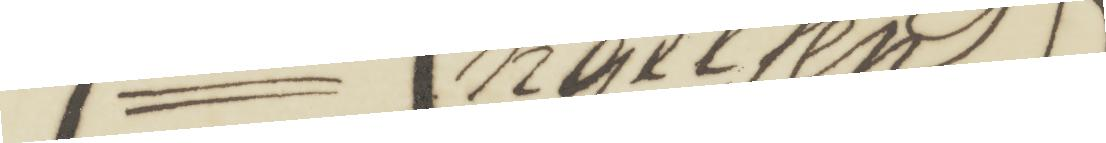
C=s Engelsen
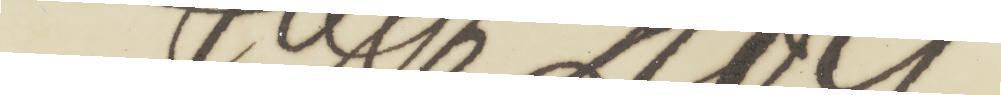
J:b de Roij
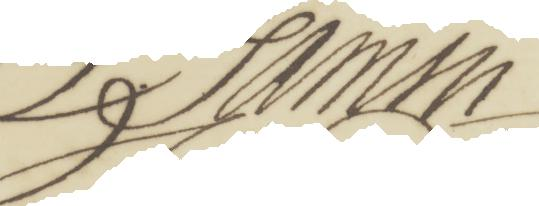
PSJamin
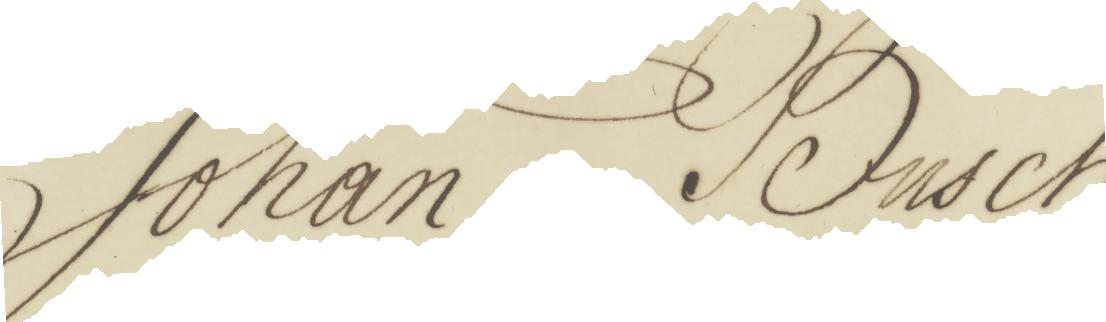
Johan Busch
